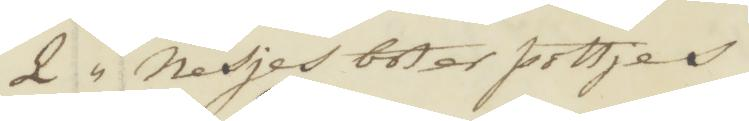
2 „ nesjes boter pottjes
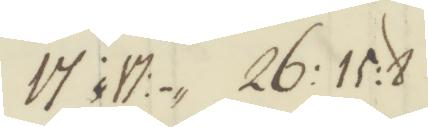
17„17:-„ 26:15:8
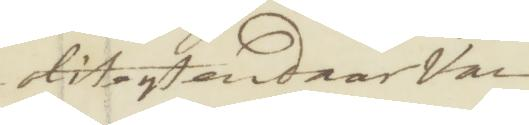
dito „ ten daar van
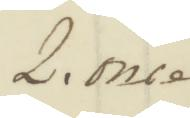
2. once
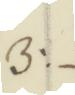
ƒ 1:3:
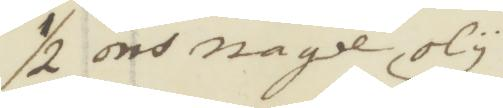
½ ons nagel olij
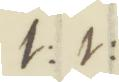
1: 1
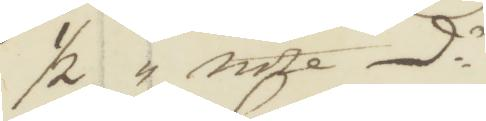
½ „ mire _:o
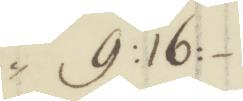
„ 9:16:–
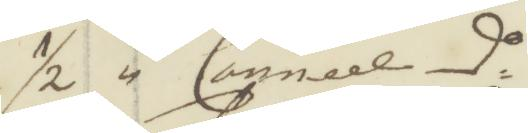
½ „ Canneel _:o
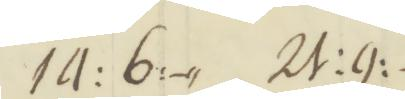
14: 6:–„ 21:9:
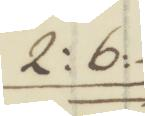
2: 6:
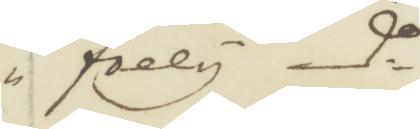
„ foelij _:o
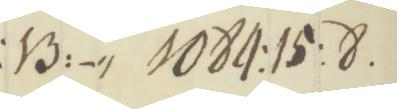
13:–„ 1084:15:8.
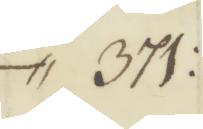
„ 371
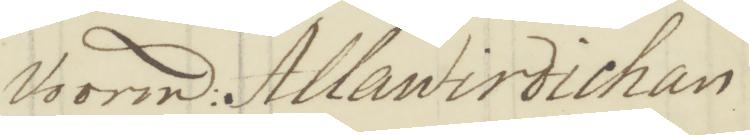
voorm: Allawirdichan
